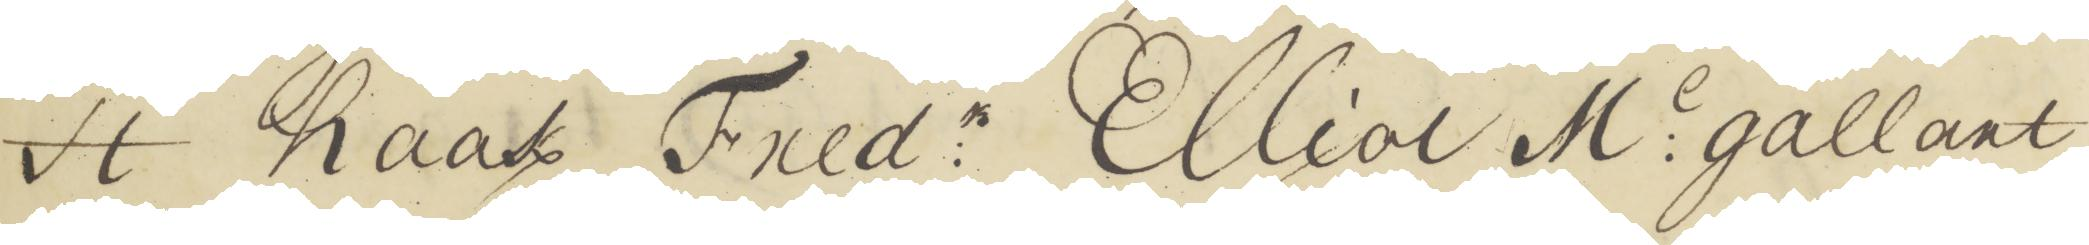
H haak Fred:k Elliot M:e gallart
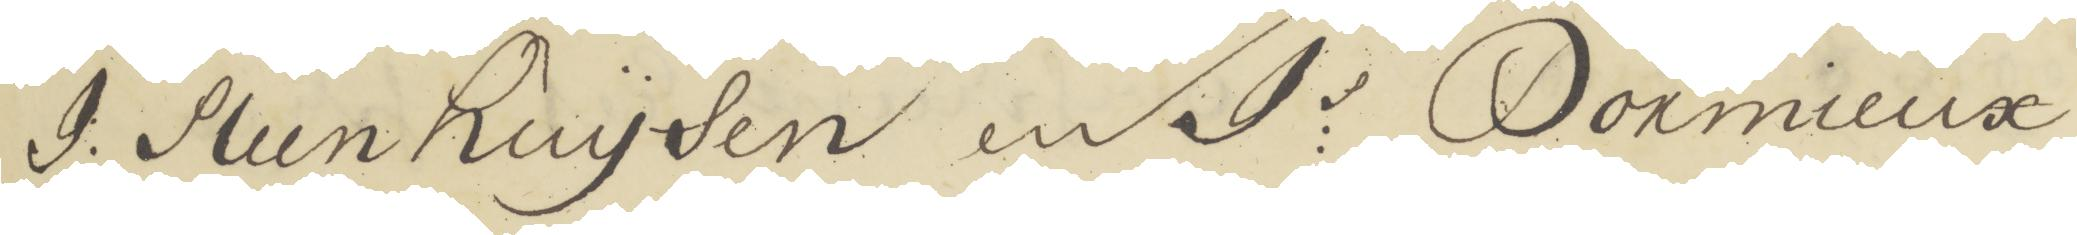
I. Steenhuijsen en I:s Dormieux
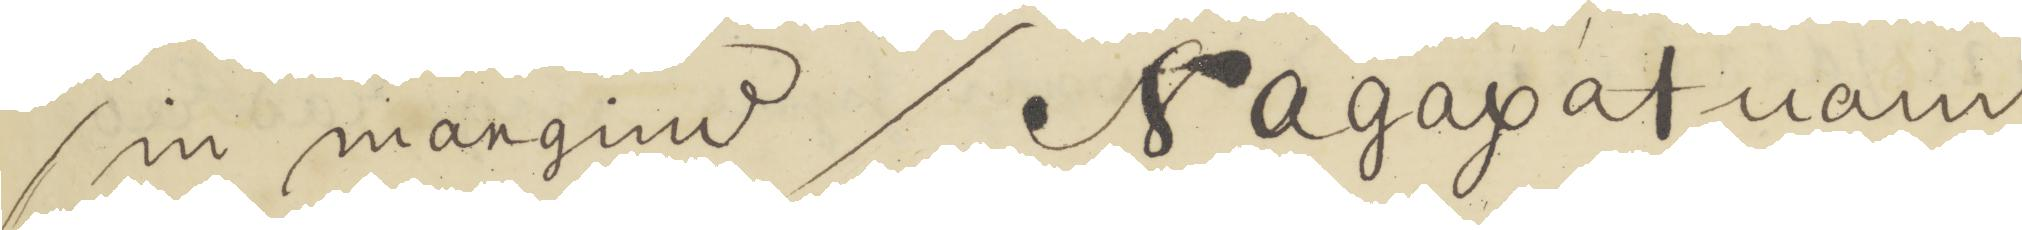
/in margine/ Nagapatnam
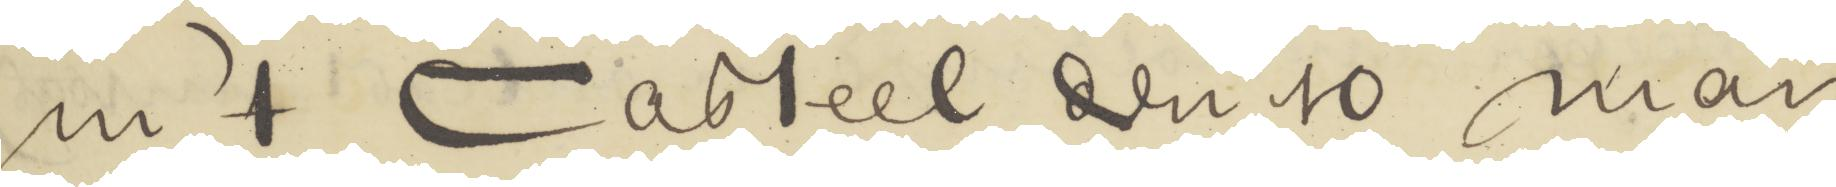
in ’t Casteel den 10 maij
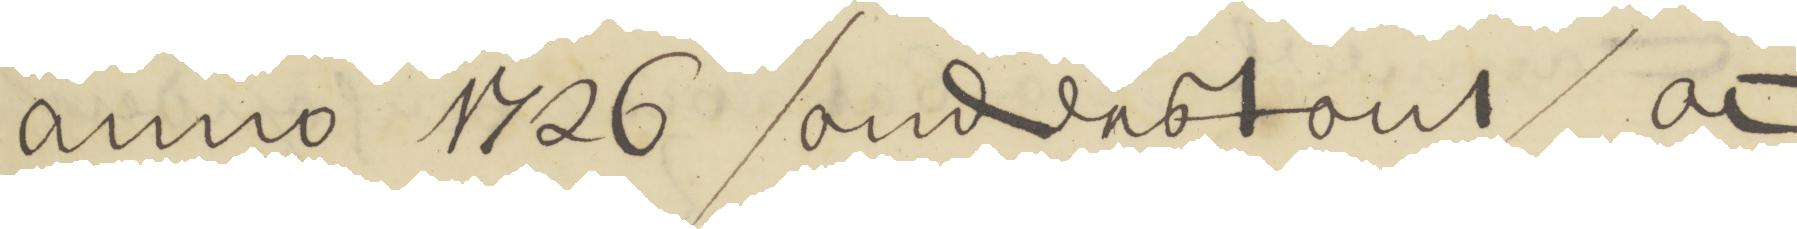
anno 1726 /onderstont ac
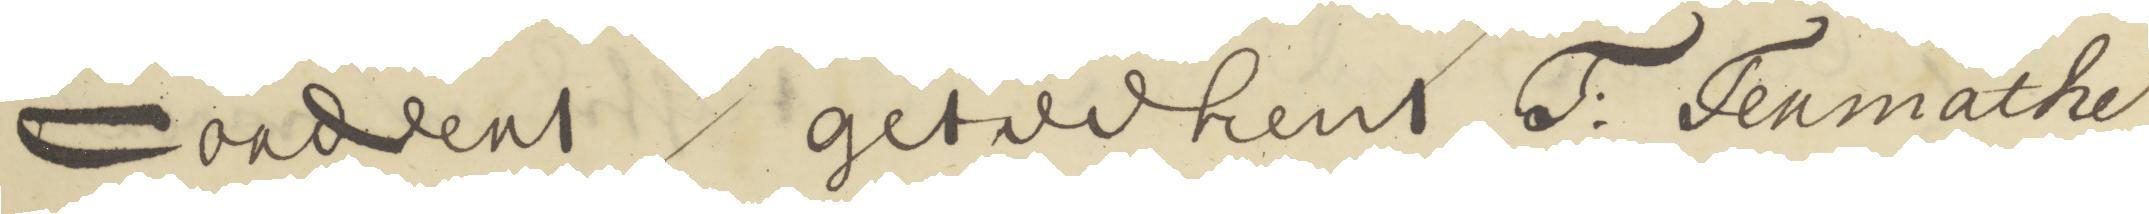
cordeert geteekent T: Termathe
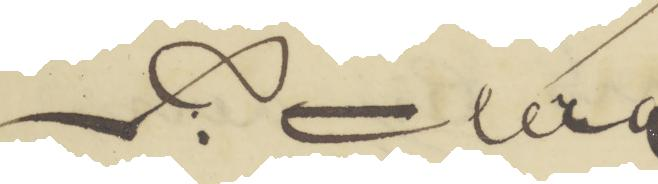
E:Clerq
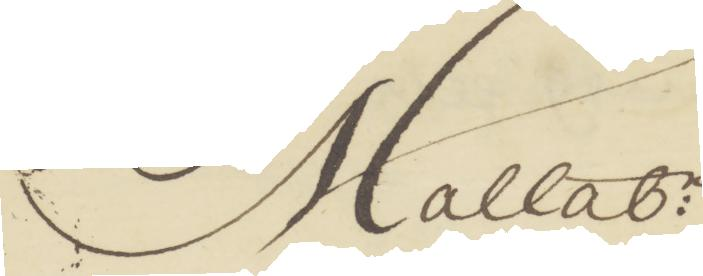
Mallab:r
